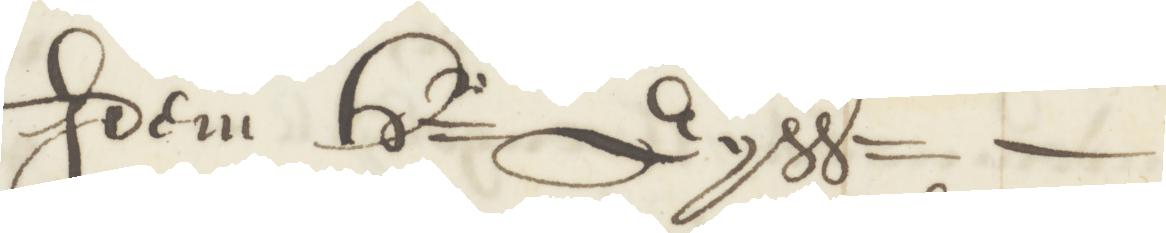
Idem H=r Eijss=r —
